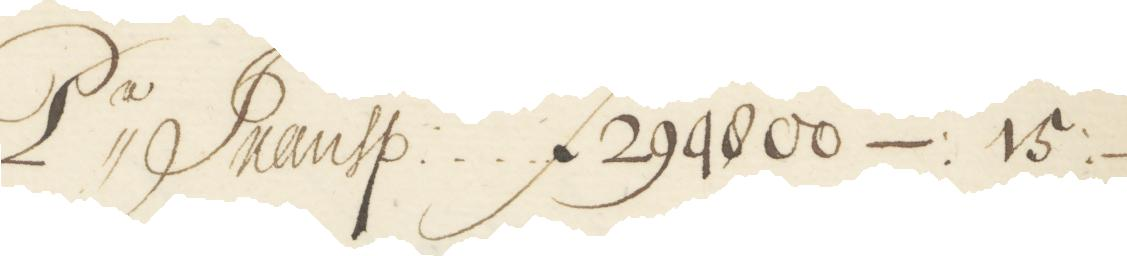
P„r Transp: ƒ29400 -: 15:
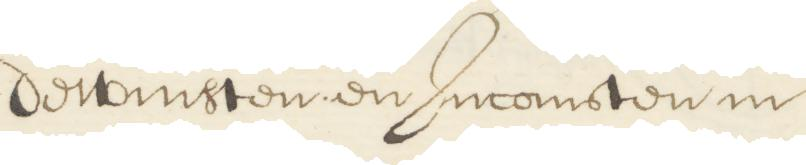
dewinsten en Incomsten in
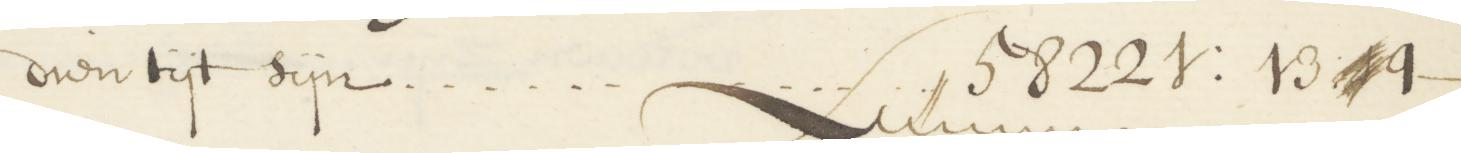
dien tijt sijn. 58221: 13: 4
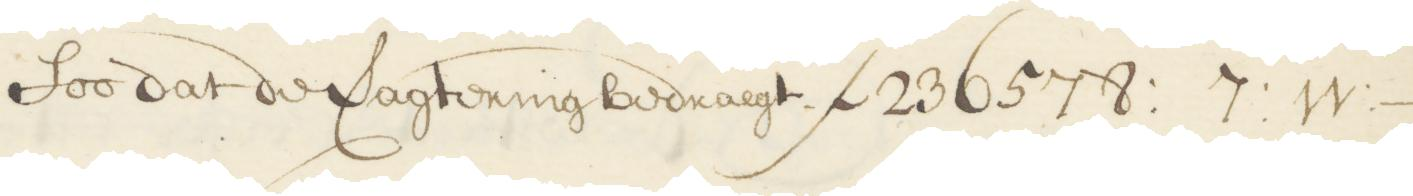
soo dat de veragteringbedraegt. ƒ236578: 7: 11:
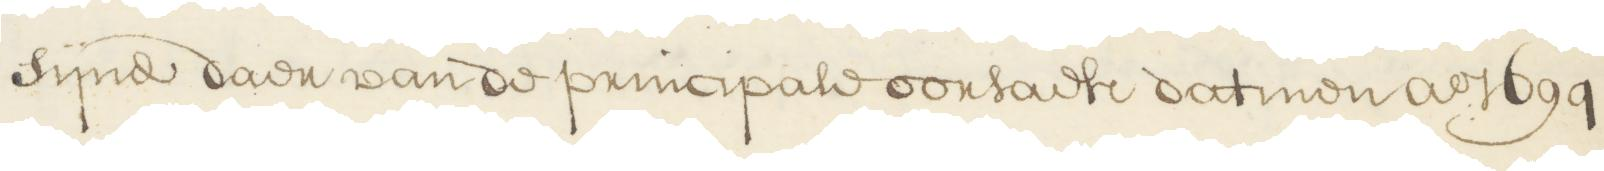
sijnde daer van de principale oorsaek dat men A:o 1694
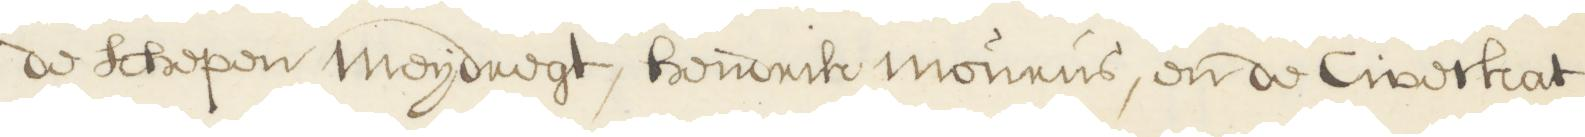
de schepen Meijdregt, hendrik mourus, en de Civetkat
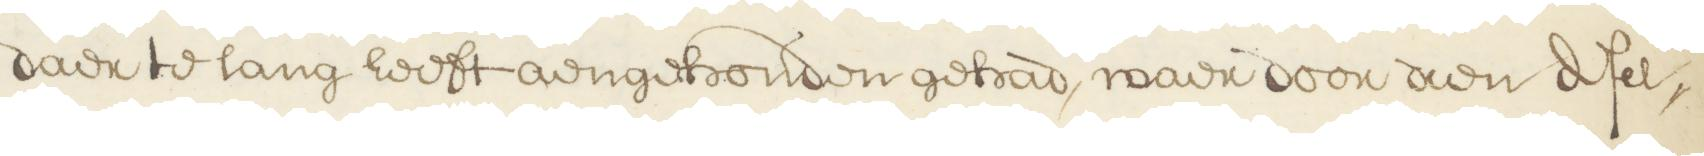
daer te lang heeft aengehouden gehad, waer door dien desel„
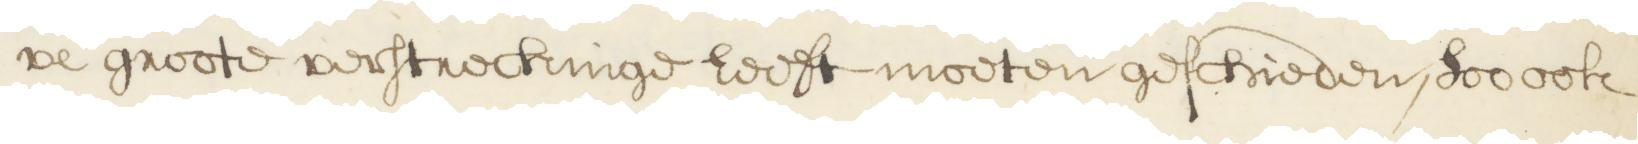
ve groote verstrockinge heeft moeten geschieden, soo ook
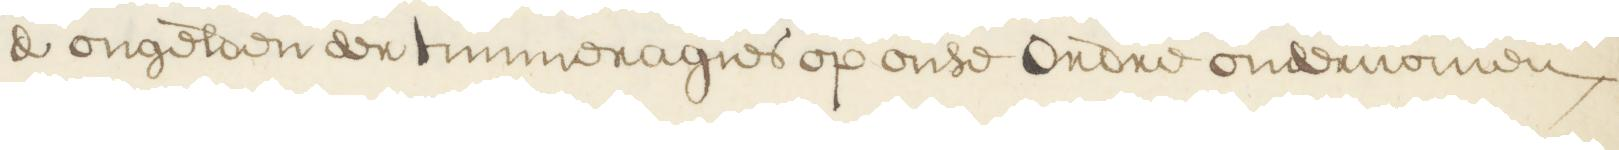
d’ ongelden der timmeragies op onse ordre ondernomen,
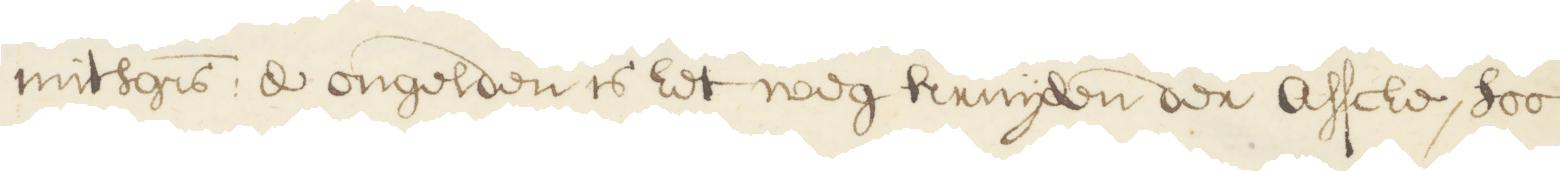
mitsgrs: de ongelden is het weg kruijden der assche, soo
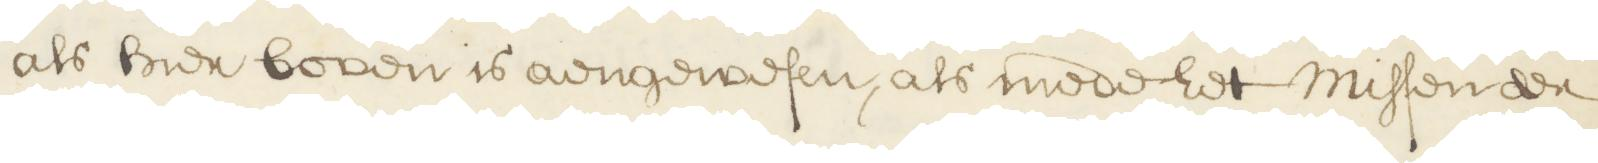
als hier boven is aengewesen, als mede het missen der
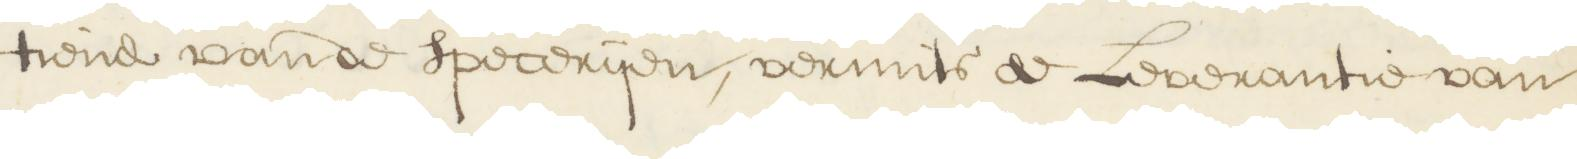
tiende van de specerijen, vermits de Leverantie van
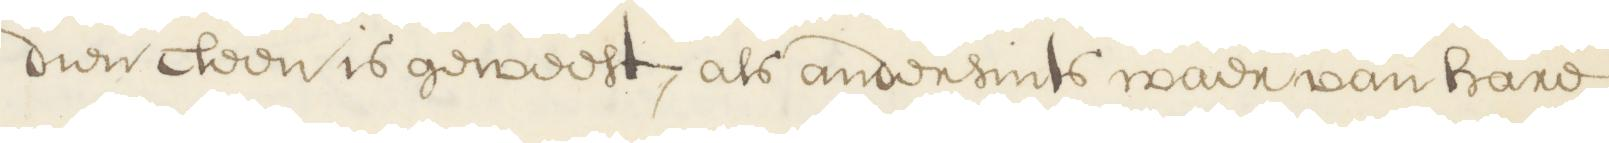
dien cleen is geweest, als andersints waer van hare
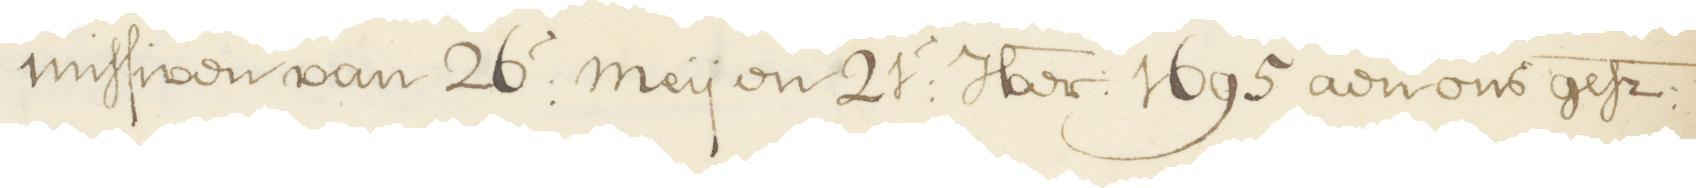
missiven van 26:e meij en 21:e 7ber: 1695 aen ons gesz:
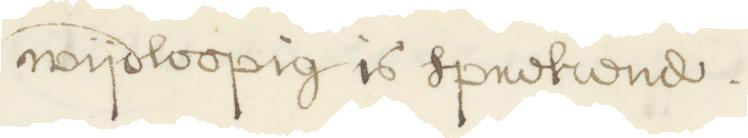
wijdloopig is sprekende.
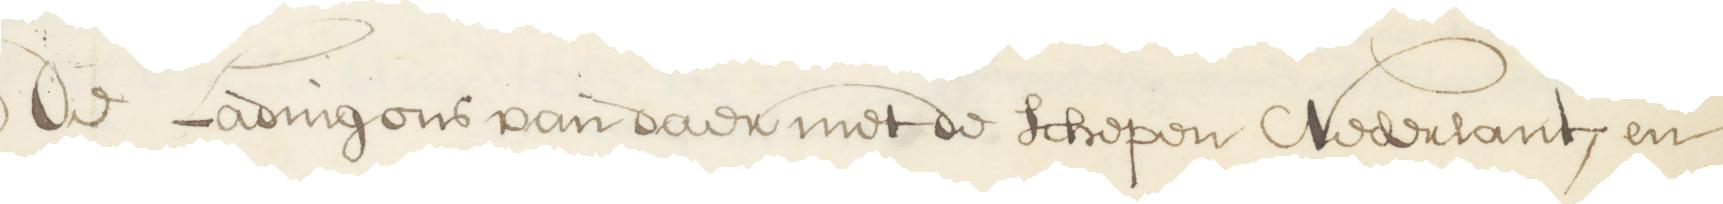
de Lading ons van daer met de schepen Nederlant, en
